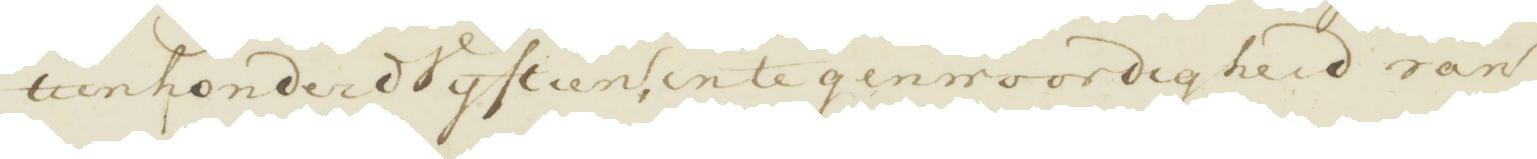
tienhonderd Vyftien, in tegenwoordigheid van
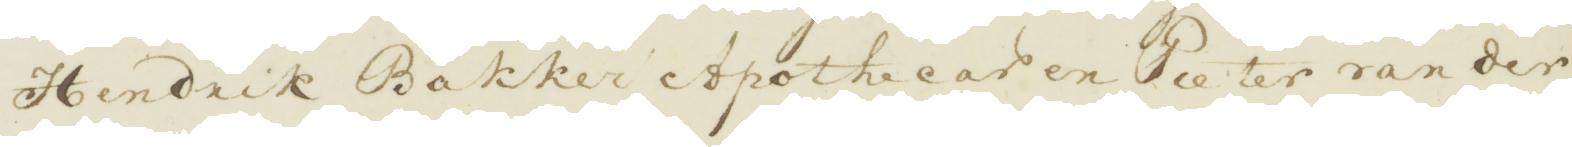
Hendrik Bakker Apothecar en Pieter van der
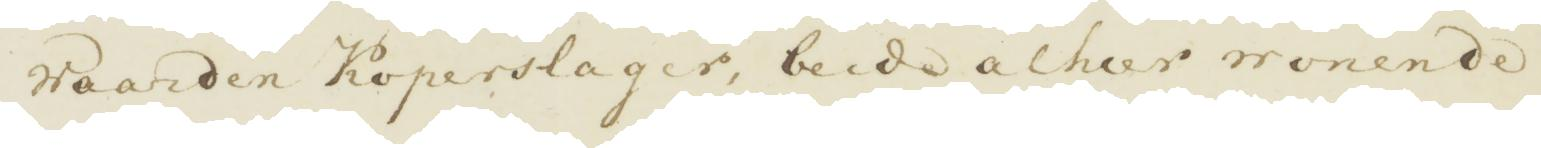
waarden Koperslager, beide alhier wonende
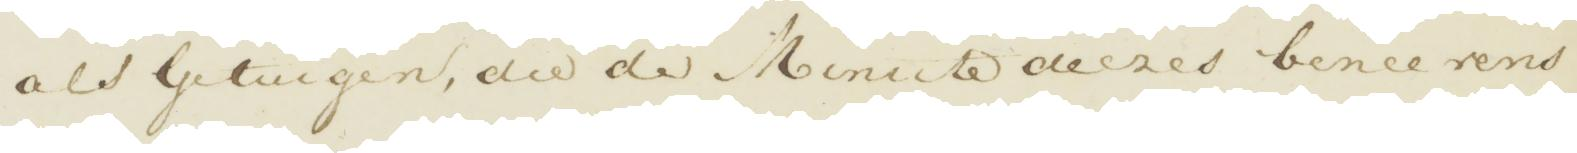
als Getuigen, die de Minute deezes beneevens
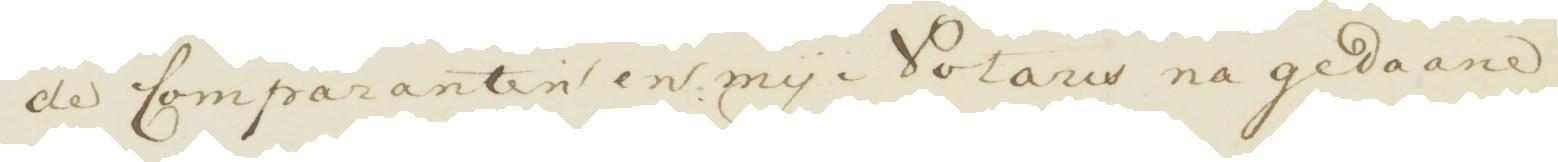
de comparanten en mij Notaris na gedaane
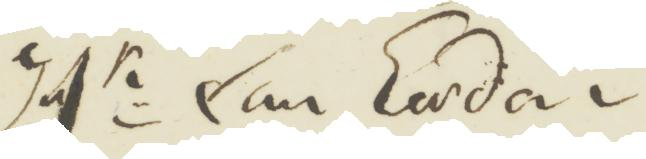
J r van Herdal
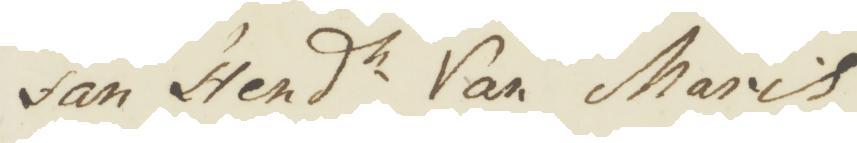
Jan Hend-k van Maris
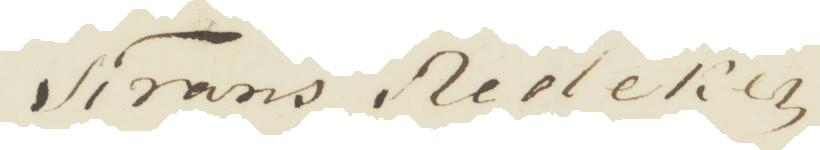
Frans Redeker
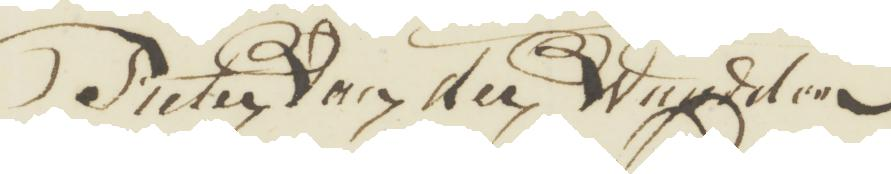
Pieter Van den Waarden
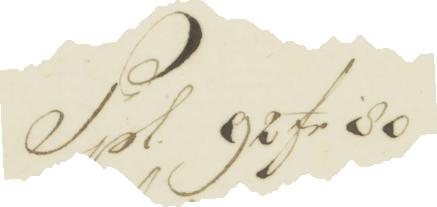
Sp. 92 fr 80
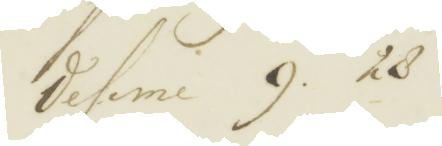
decime 9. 28
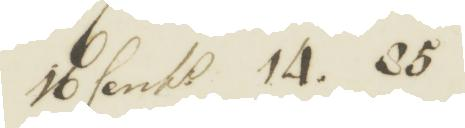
16 Cents 14. 85
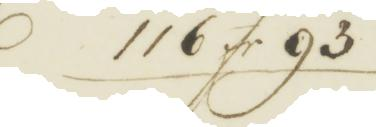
116 fr 93
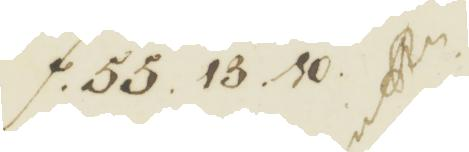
ƒ. 55.13.10.
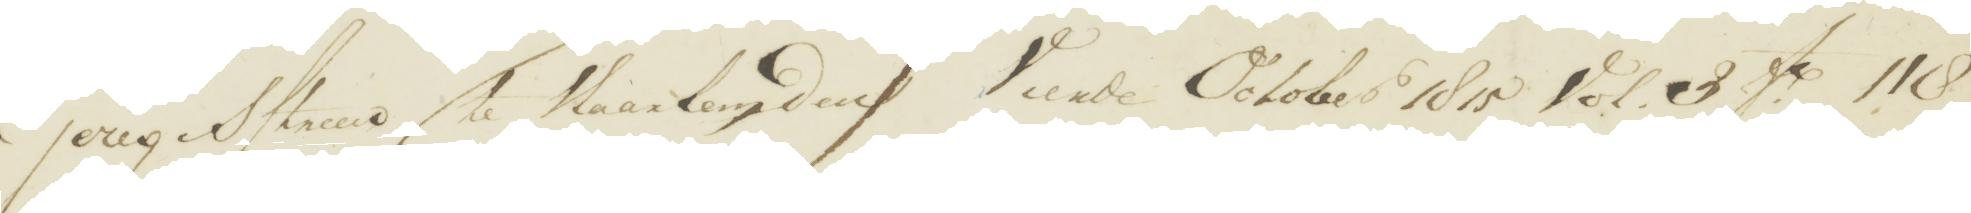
Geregistreerd te Haarlem den Vierde October 1815 Vol. 3 fr.118
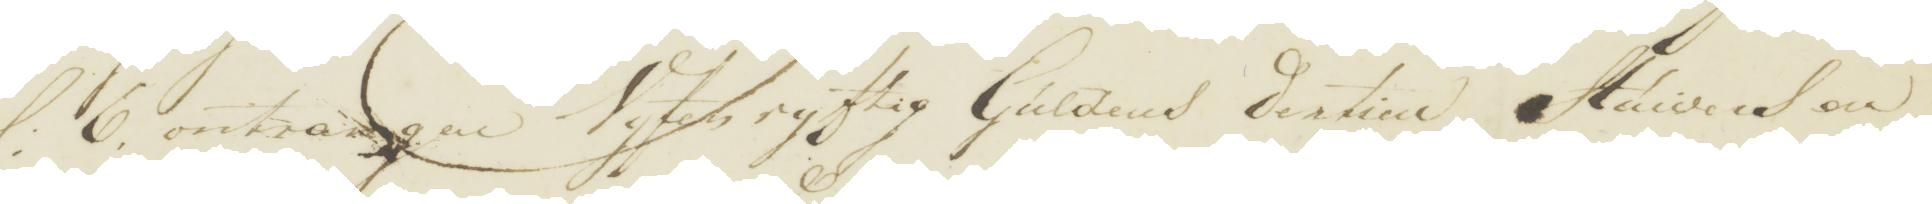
C: 6. ontvangen Vyf en vyftig Guldens dertien stuivers en
